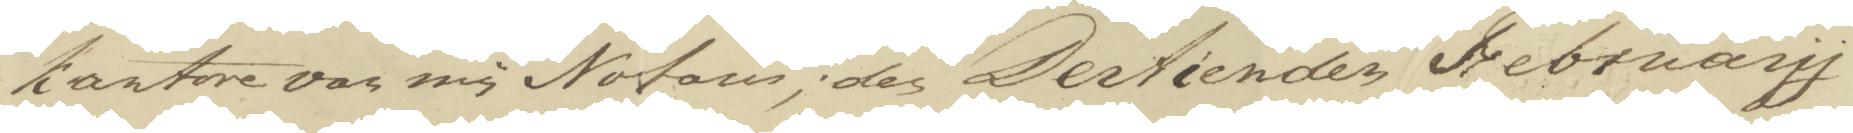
kantore van mij Notaris; den Dertienden Februarij
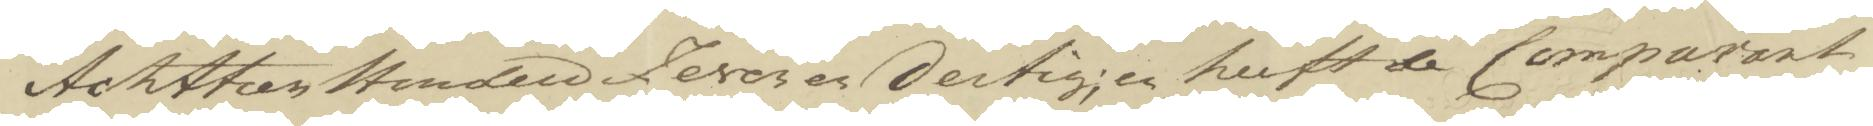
Achttien Honderd Zeven en dertig; en heeft de Comparant
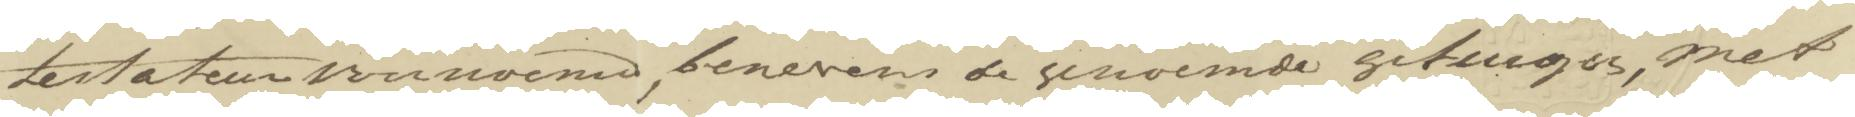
testateur voernoemd, benevens de genoemde getuigen, met
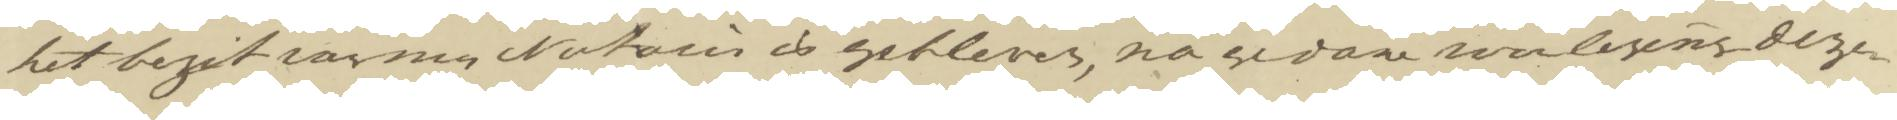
het bezit van my Notaris is gebleven, na gedane voorlezing dezen
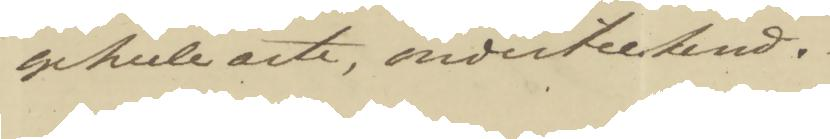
geheele acte, onderteekend.
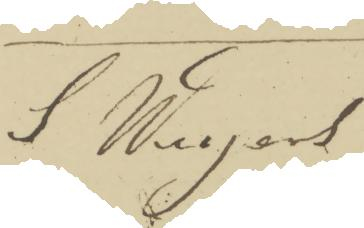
S Weyers
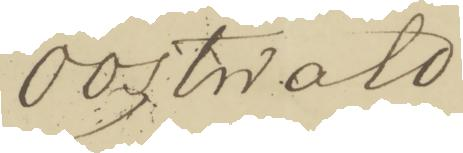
J. oostwald
